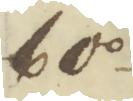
6 do
